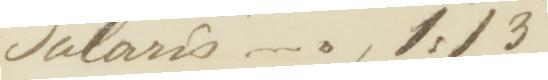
Salaris — „ 1: 13
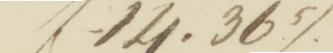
ƒ14.36 5/.
